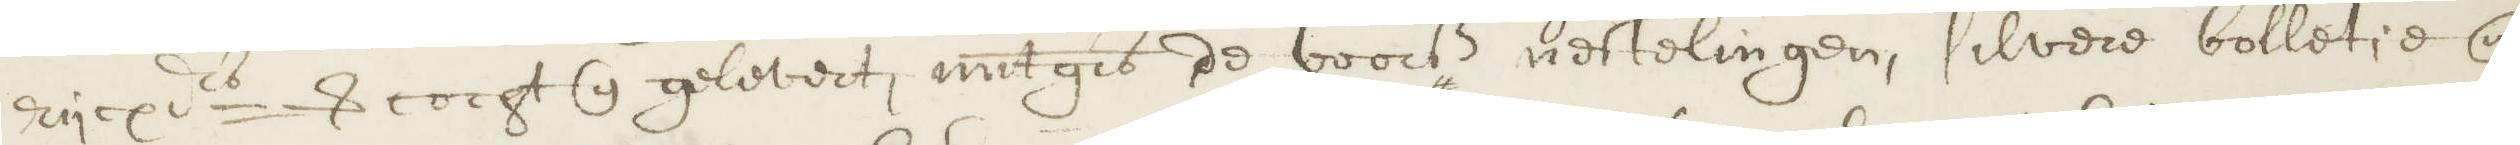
rijcxd=rs vercorht ende gelevert, mitgrs de voors nestelingen, silvere bolletje ende
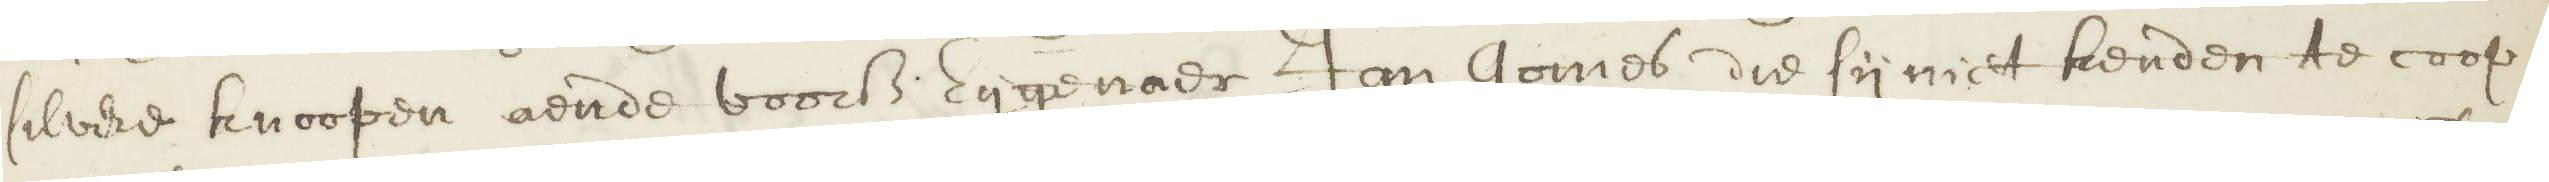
silvere knoopen aende voors eijgenaer Jan Gomes die sij niet kenden te coop
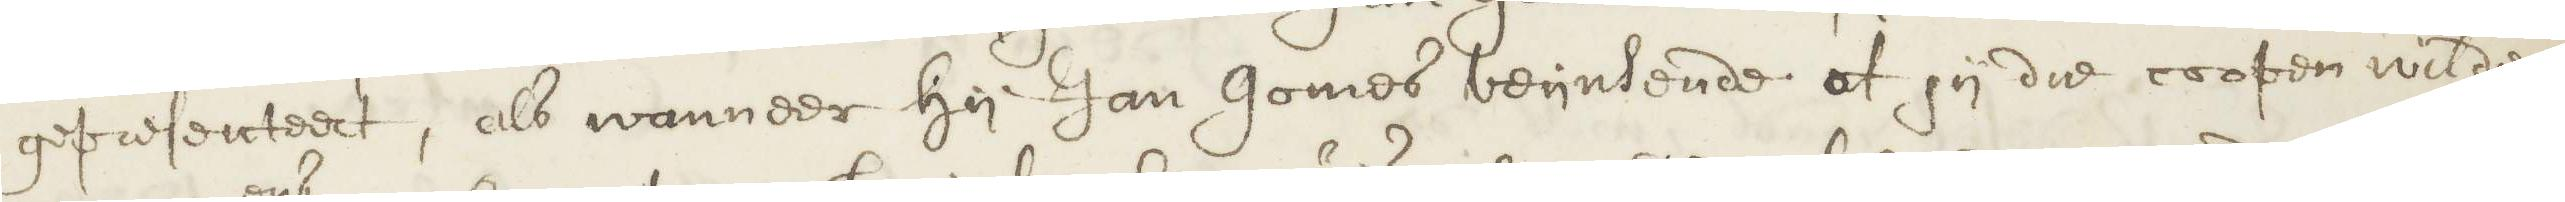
gepresenteert, als wanneer hij Jan Gomes veijnsende af hij die coopen wilde
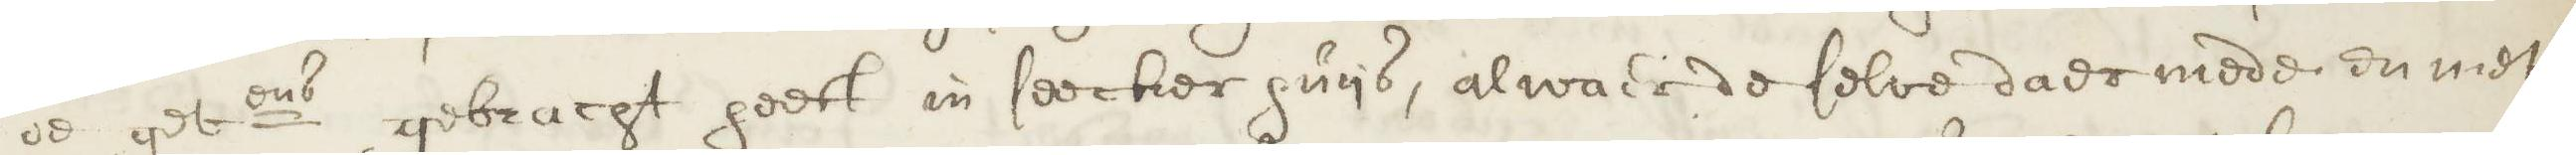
de gev=ens gebracht heeft in seecker huijs, alwaer de selve daer mede en met
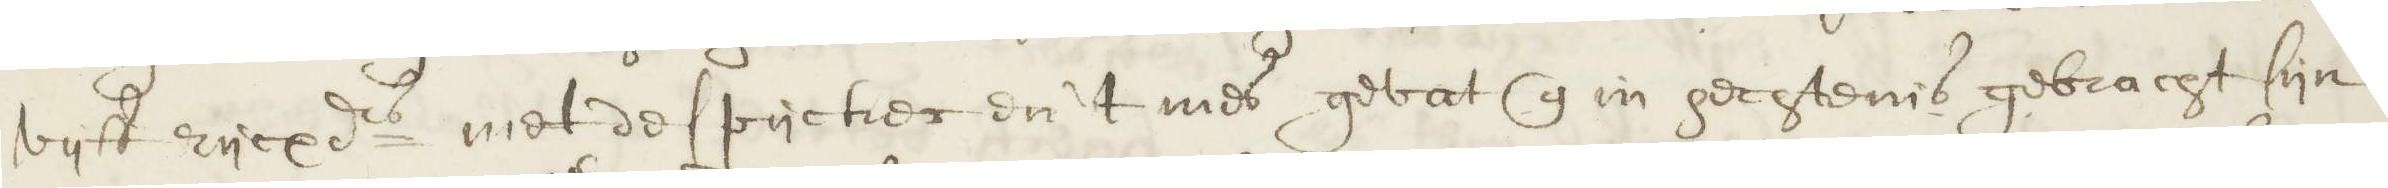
vijff rijcxd=rs met de spijcker en ’t mes gevat ende in hechtenis gebracht sijn
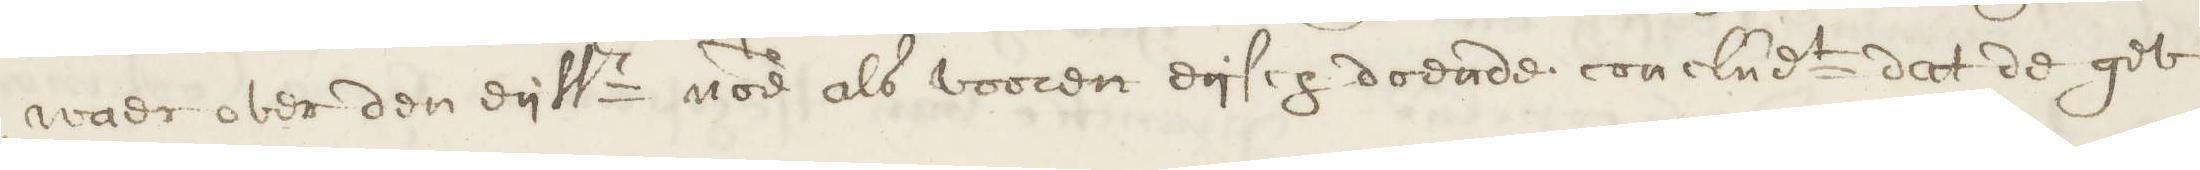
waer over den eijss=r noe als vooren eijsch doende conclud=t dat de gev=ens sullen
